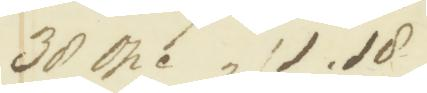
38 opc „ 1.18
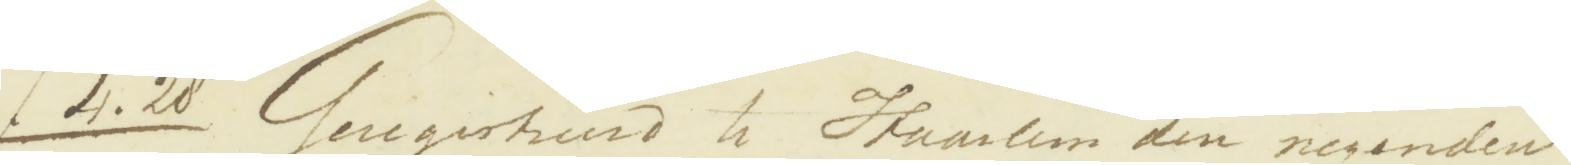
ƒ 4. 28 Geregistreerd te Haarlem den negenden
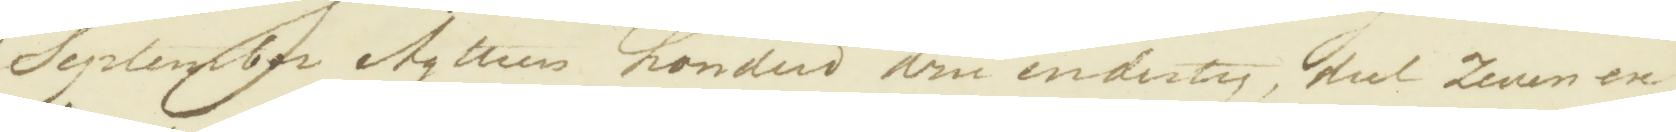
September Agttien honderd drie endertig, deel zeven en
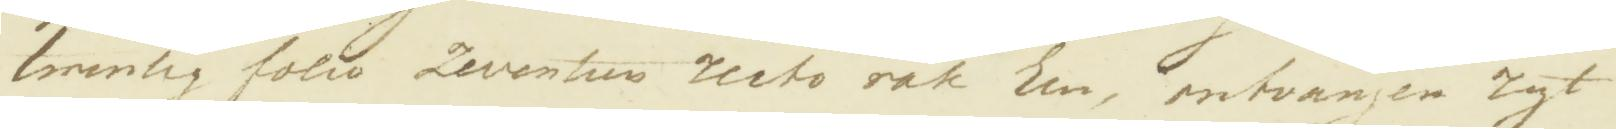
twintig folio zeventien recto vak Een, ontvangen regt
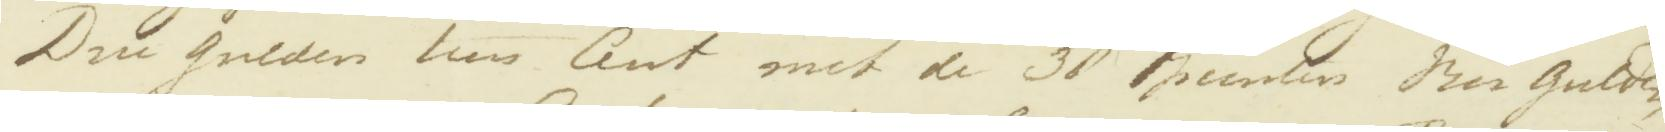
Drie gulden tien Cent met de 38 Opcenten Vier Gulden
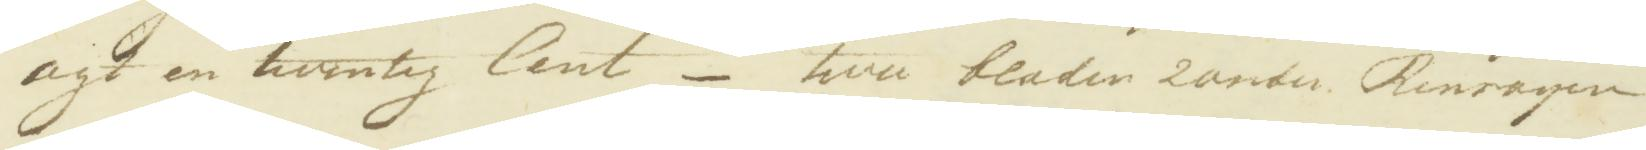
agt en twintig Cent — twee bladen zonder Renvoyen
